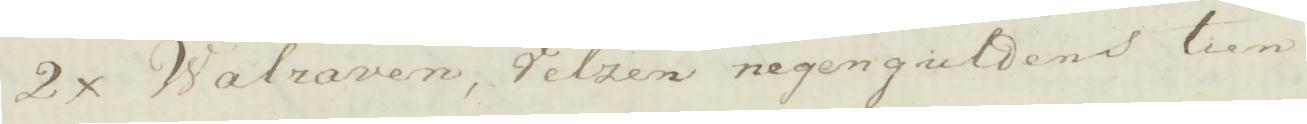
2x Walraven, Velzen negen guldens tien
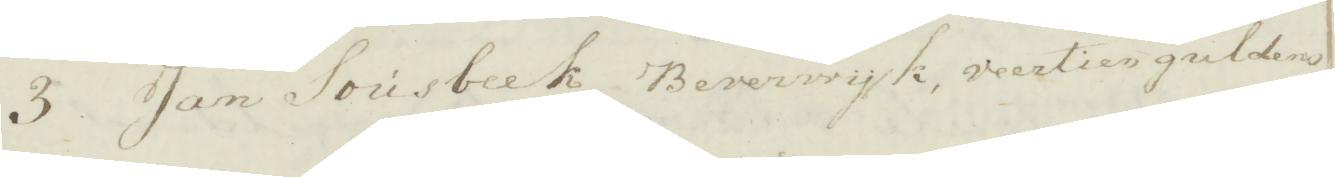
3. Jan Sousbeek, Beverwijk, veertien guldens
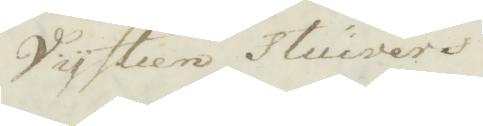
Vijftien stuivers
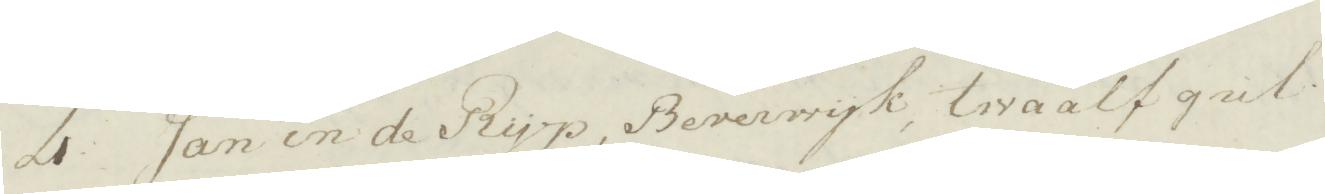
4: Jan in de Rijp, Beverwijk, twaalf gul.
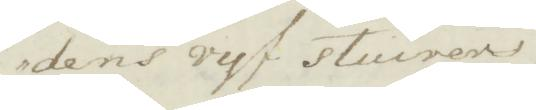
„dens vyf stuivers
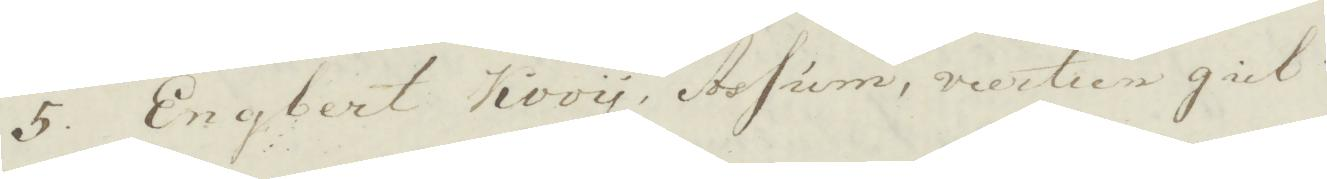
5. Engbert Kooij, Assum, veertien gul
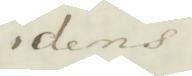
,dens
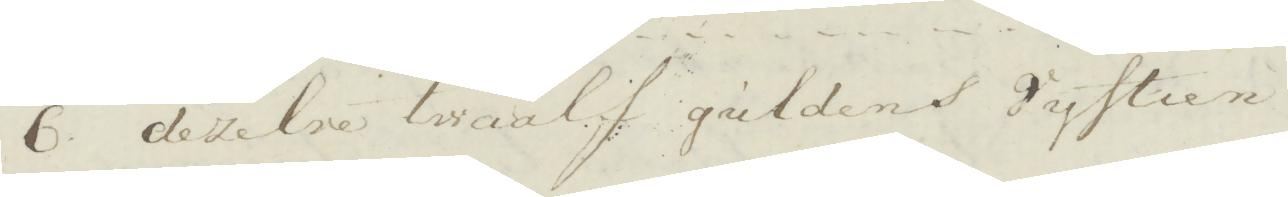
6. dezelve twaalff guldens Vijftien
